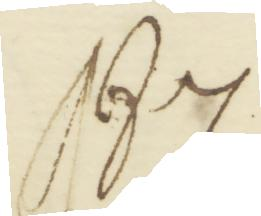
487
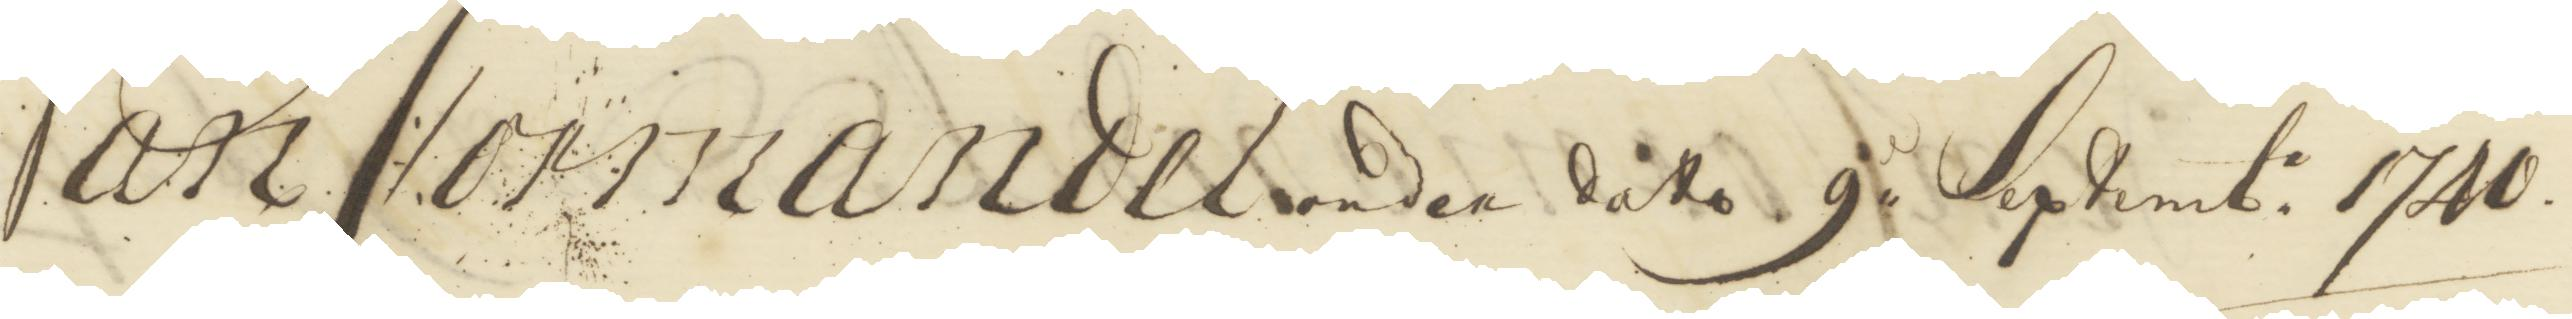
Van Cormandel onder dato 9„e Septemb„r 1740.
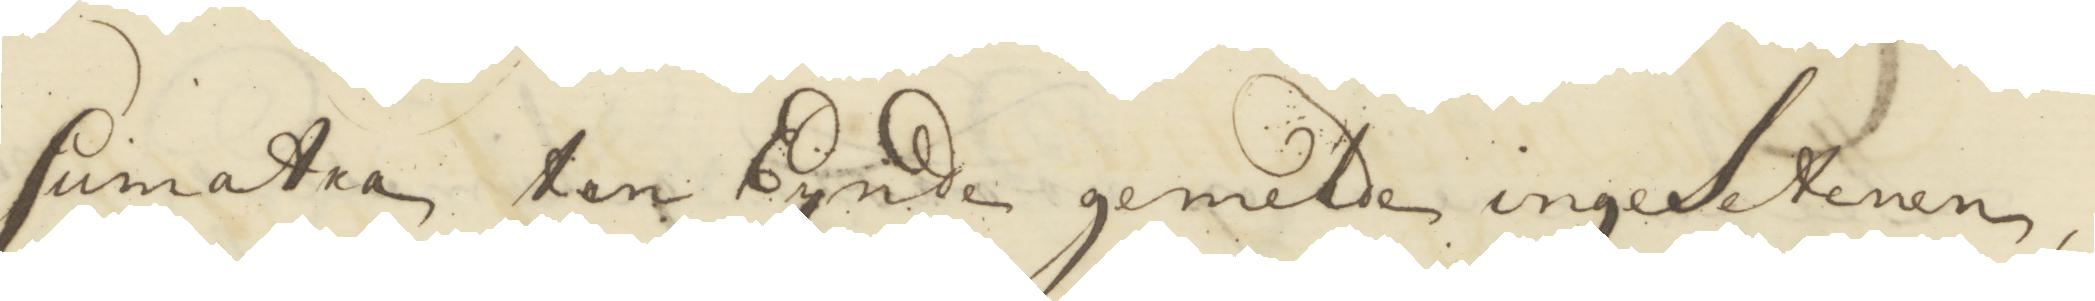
sumatra ten Eijnde gemelde ingesetenen,
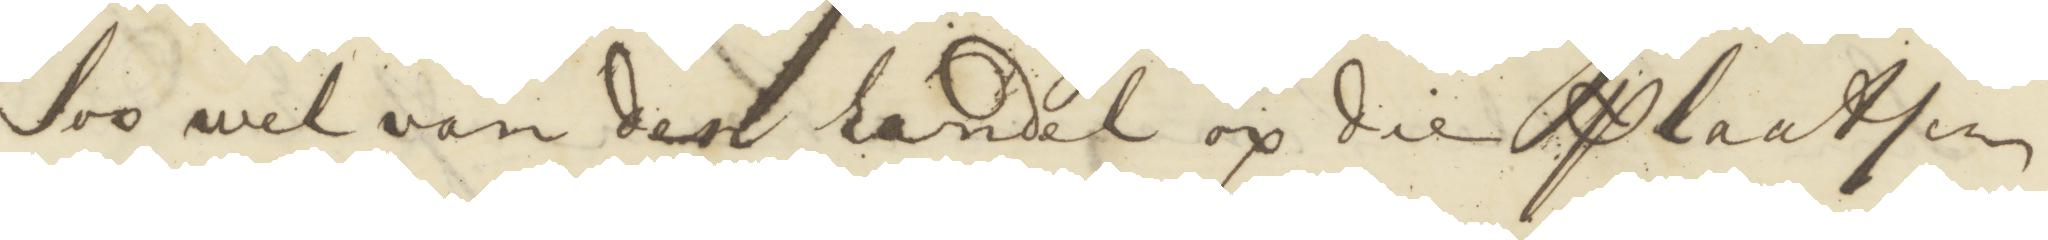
soo wel van den handel op die plaatsen
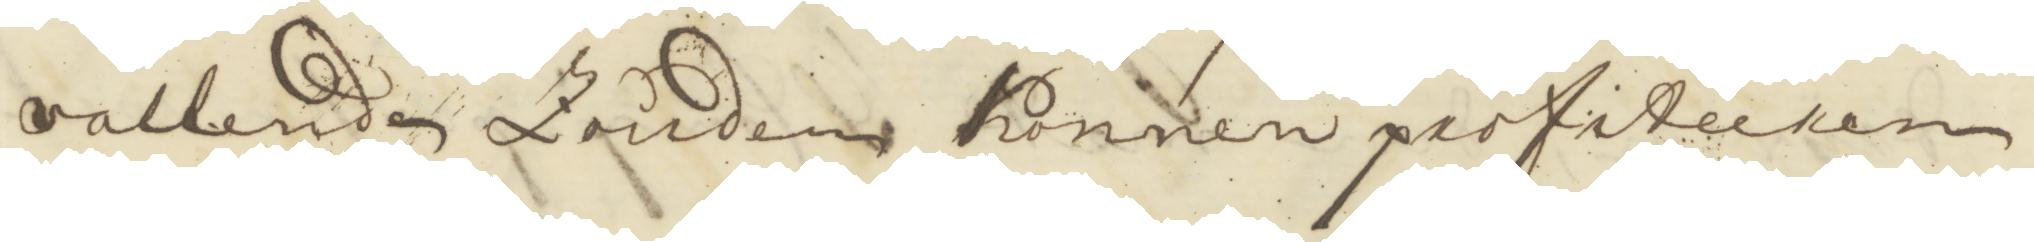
vallende zouden konnen profiteeren
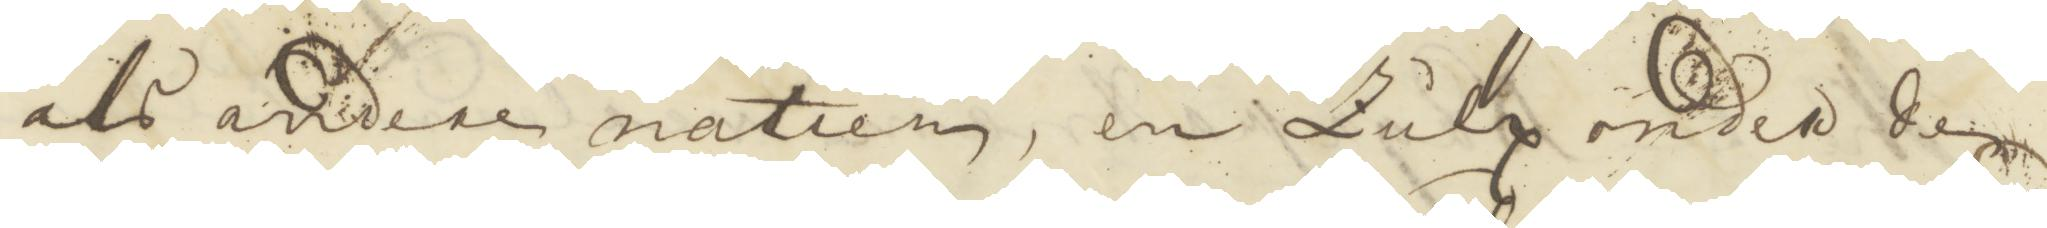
als andere natien, en zulx onder den
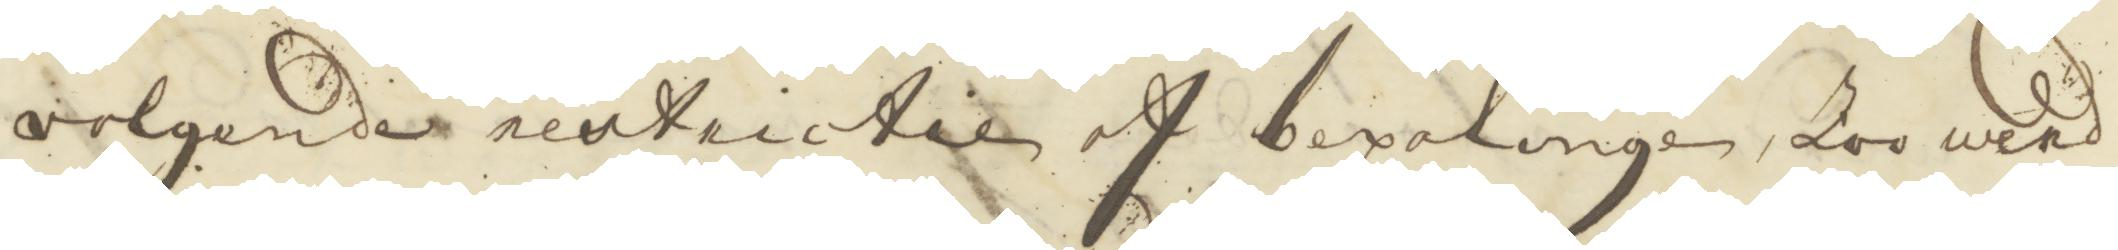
volgende restrictie of bepalinge, zoo werd
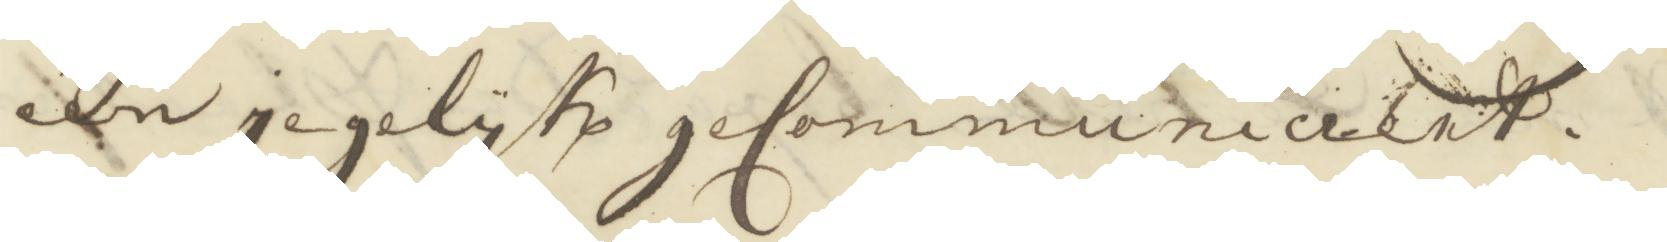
een jegelijk gecommuniceert.
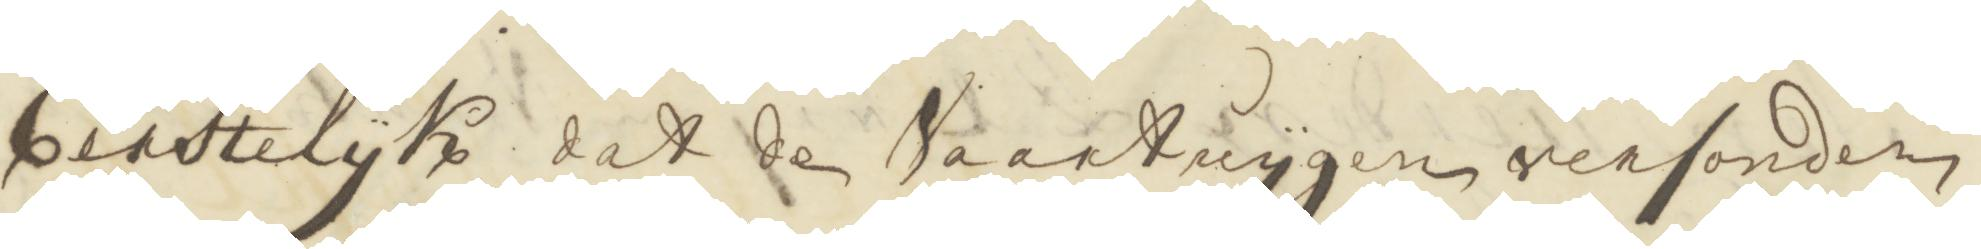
Eerstelijk dat de Vaartuijgen versonden
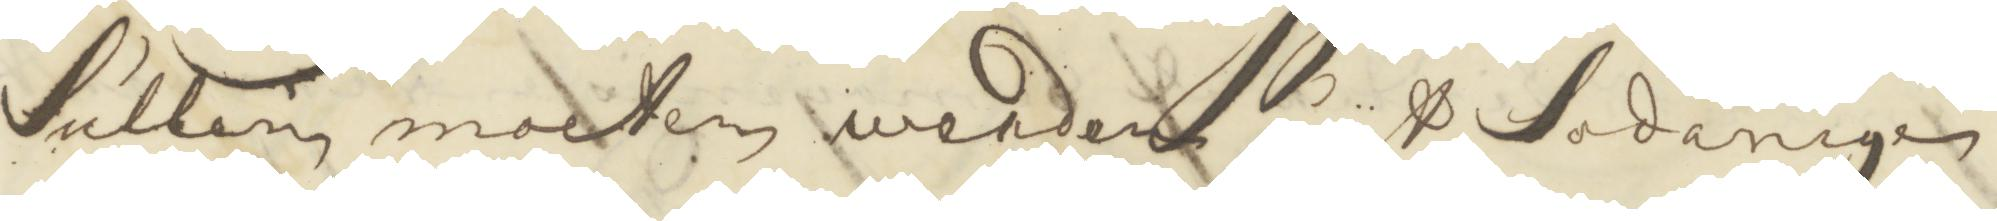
sullen moeten werden uijt sodanige
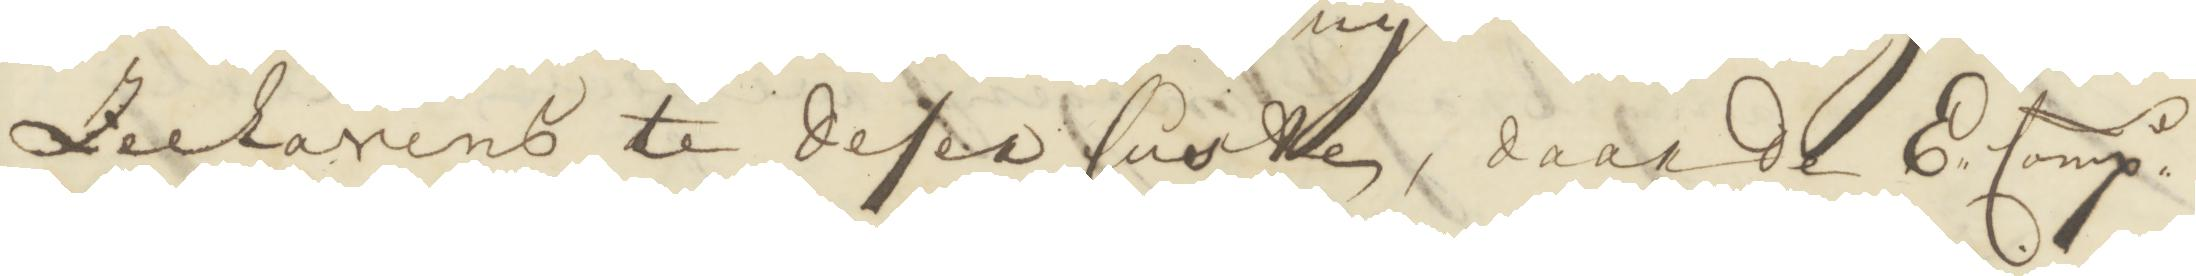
zeehavens te deser Custe, daar de E„ Comp„
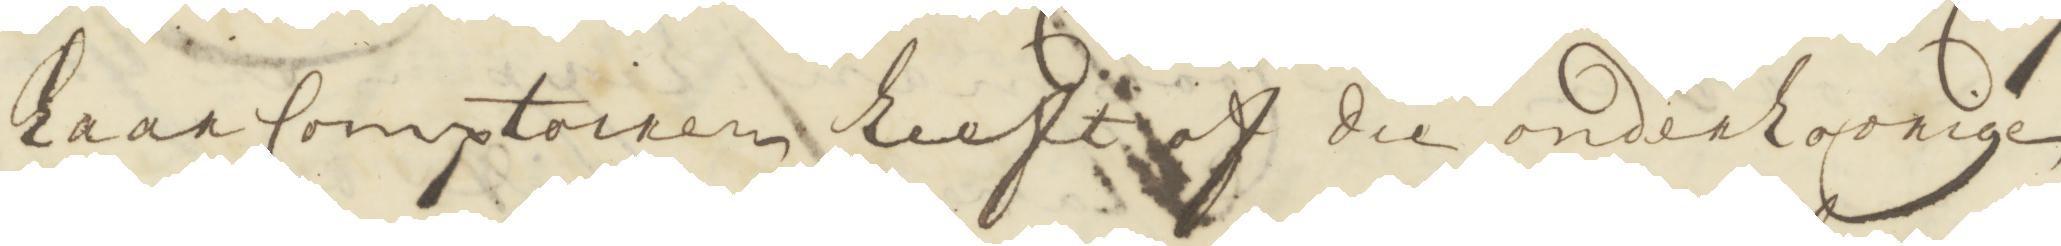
haar Comptoiren heeft of die onderhoorige
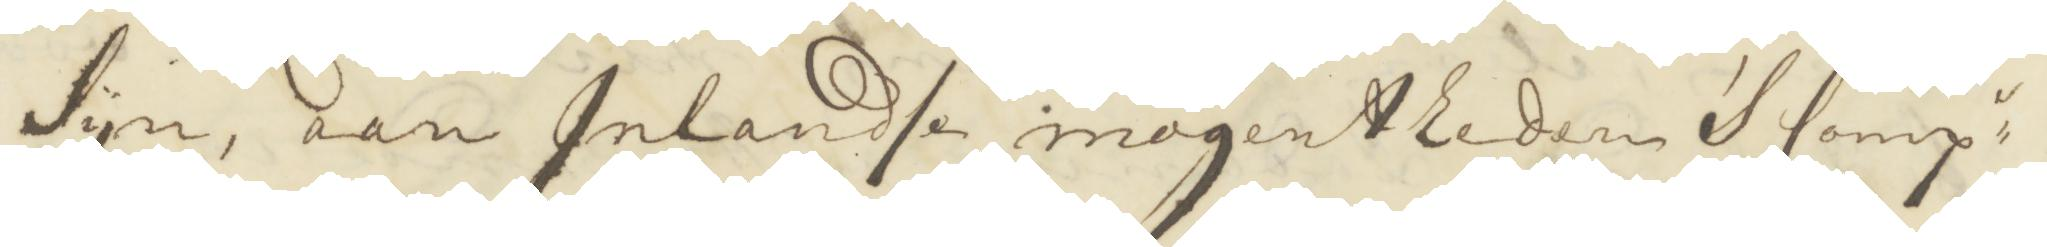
sijn, aan Jnlandse mogentheden ’s Comp„e
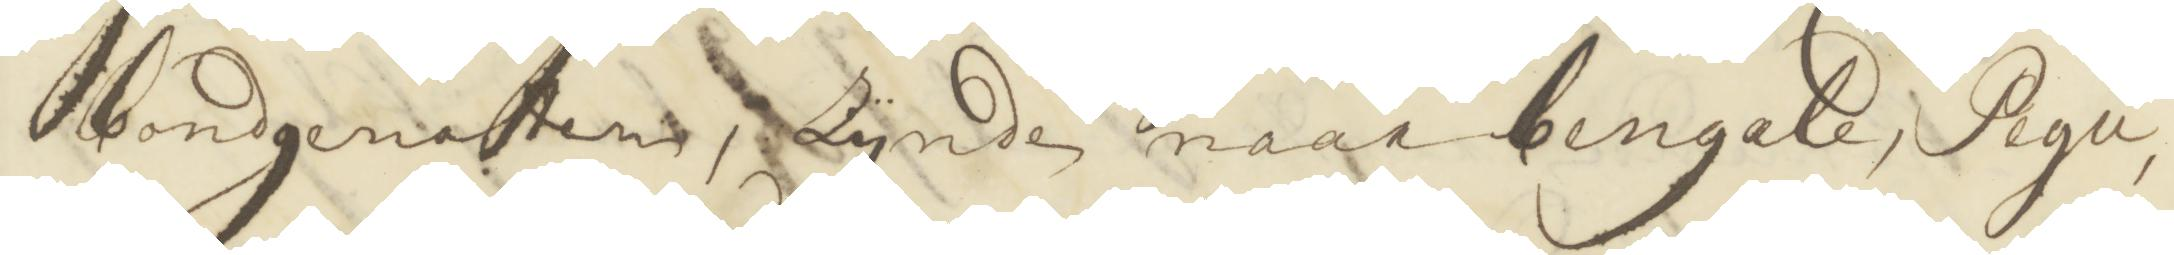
bondgenoten, zijnde naar bengale, Pegu,
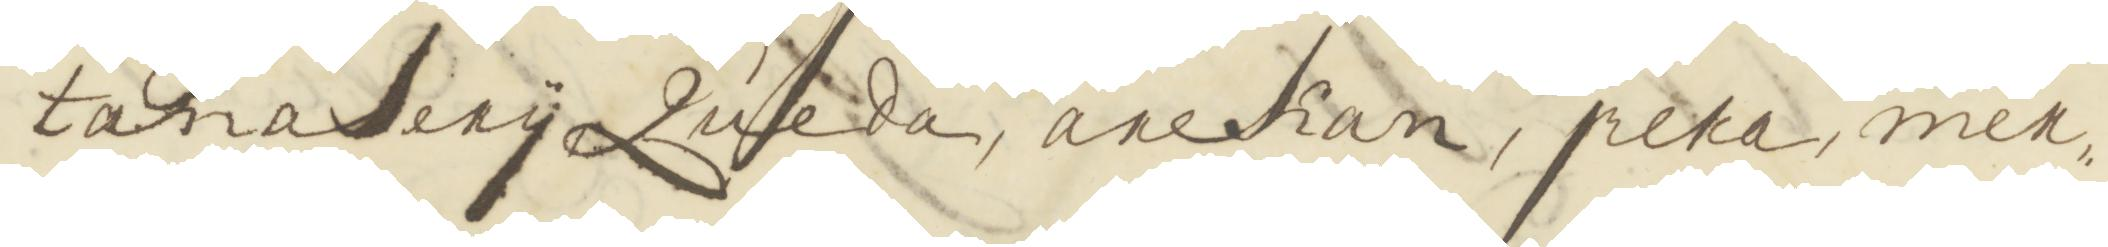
tana Serij Lueda, arekan, peka, mer„
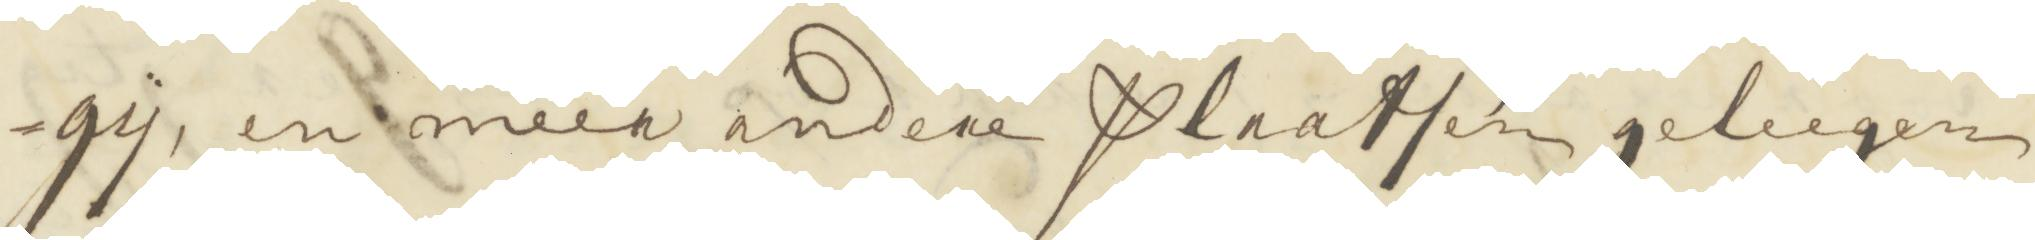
=gij, en meer andere plaatsen geleegen
